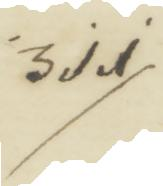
314
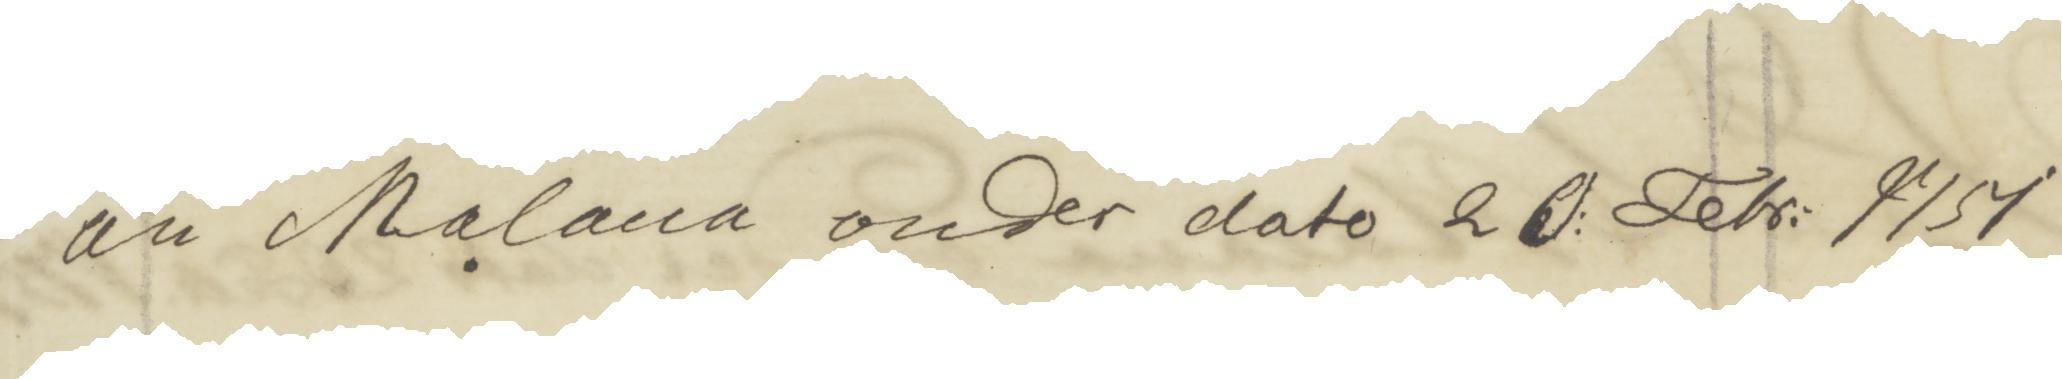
Van Malacca onder dato 20: Feb: 1757
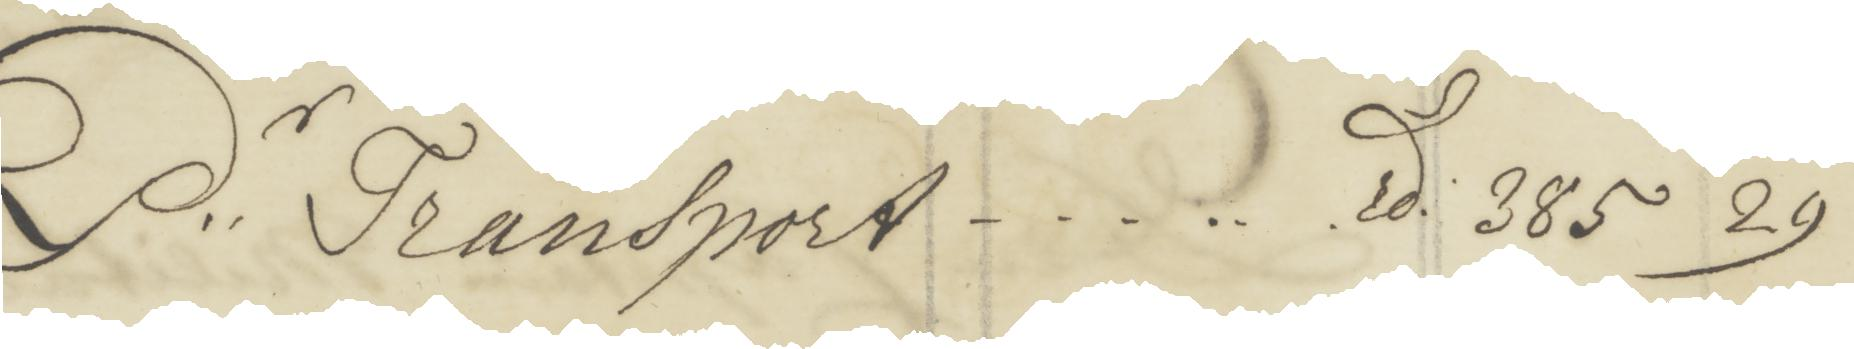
P„r Transport - - - - - - rd: 385 29
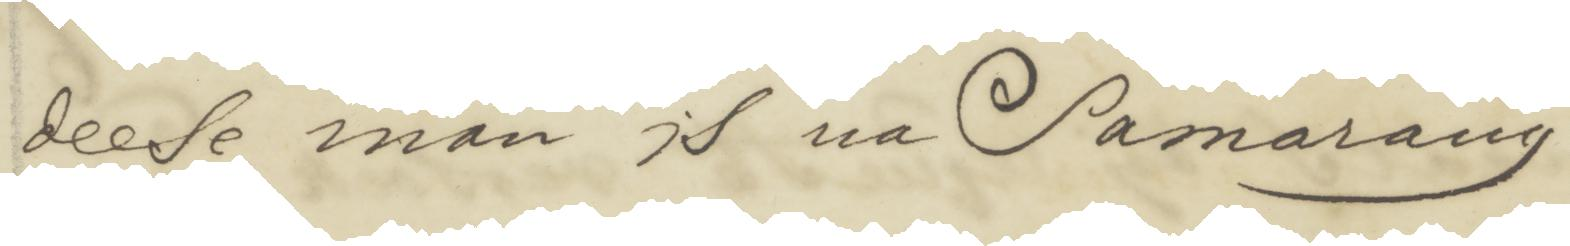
deese man is na Samarang vertrocken
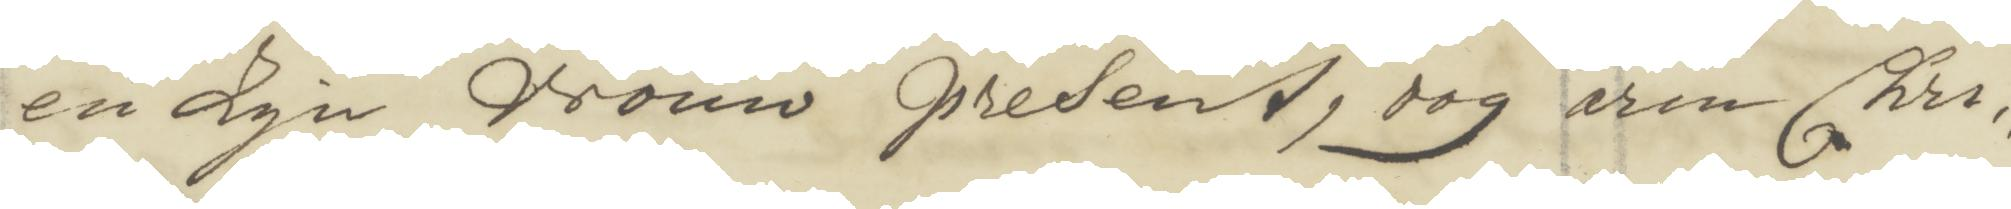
en zijn vrouw present, dog arm Chri„
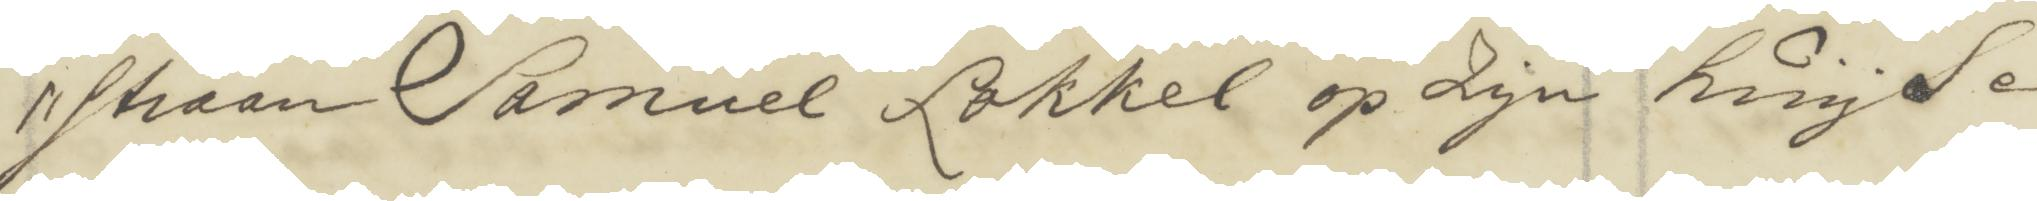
„stiaan Samuel Lokkel op zijn huijse
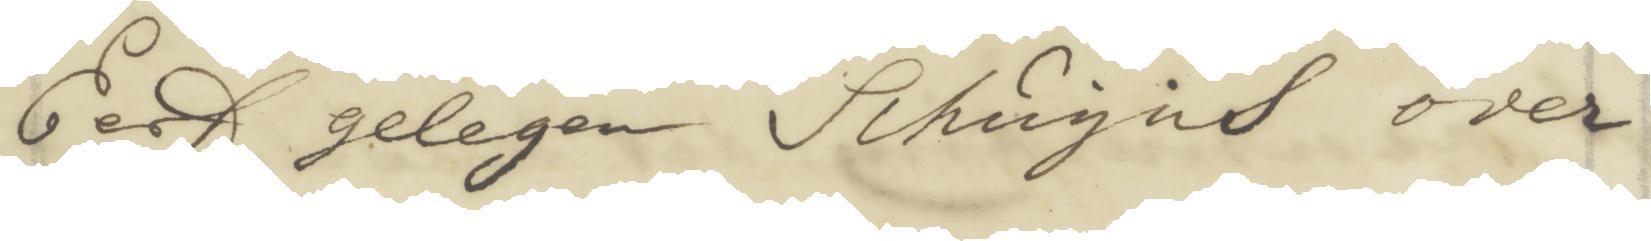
Eerf gelegen Schuijns over
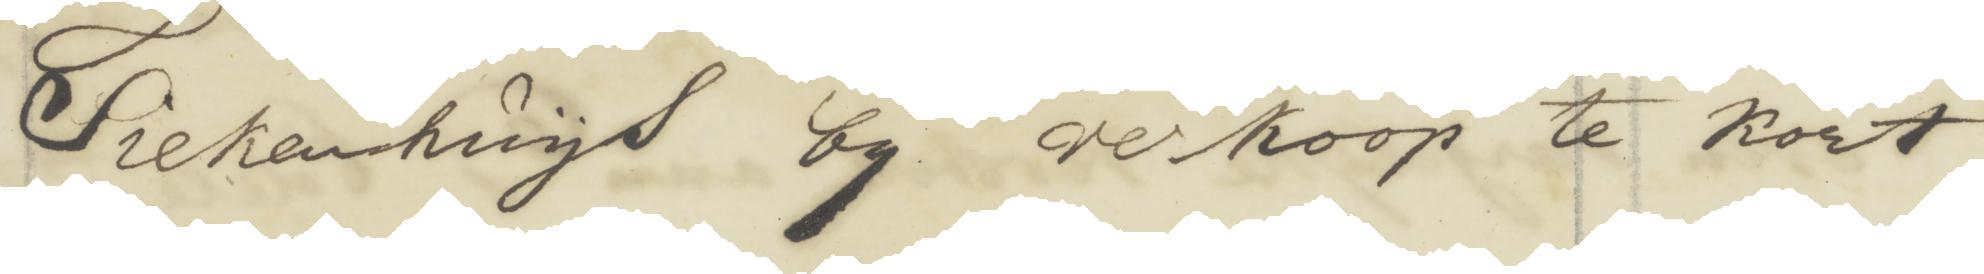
Siekenhuijs bij verkoop te kort
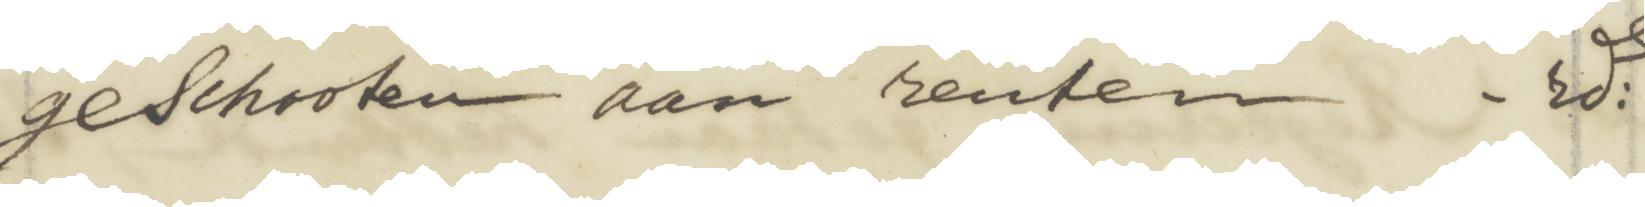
geschooten aan renten - rd:s - - - - „ 23. —
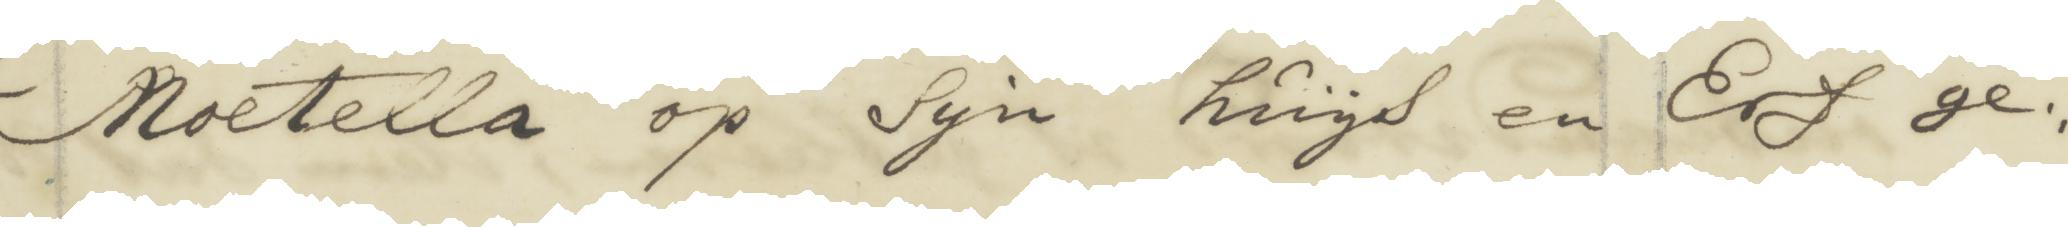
Moetella op sijn huijs en Erf ge„
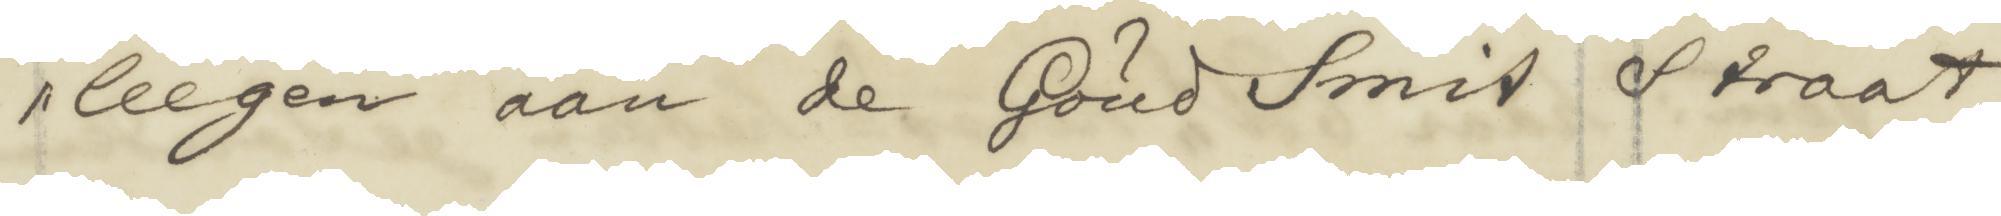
„leegen aan de Goudsmit straat
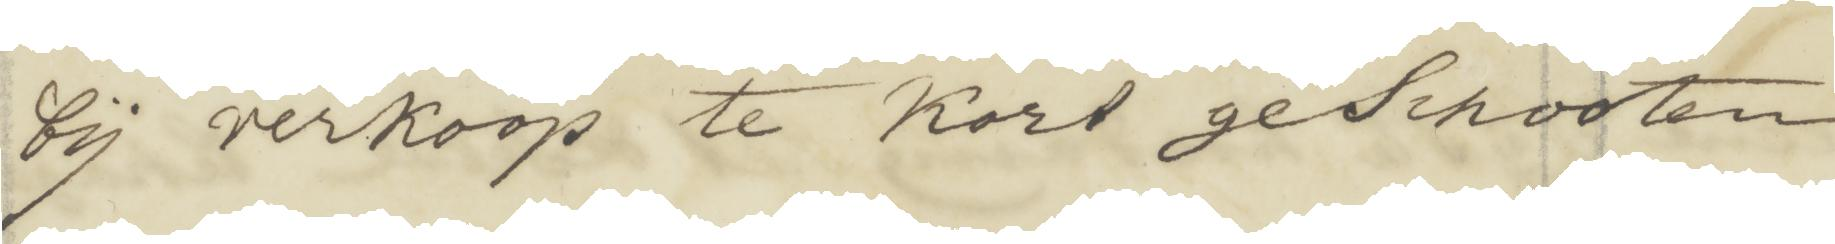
bij verkoop te kort geschooten
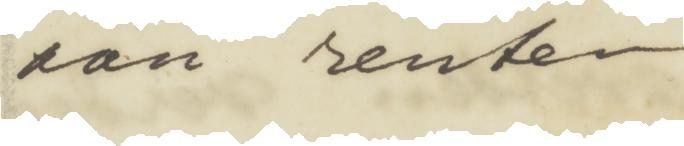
aan renten - - - „ - - - „ 29 6
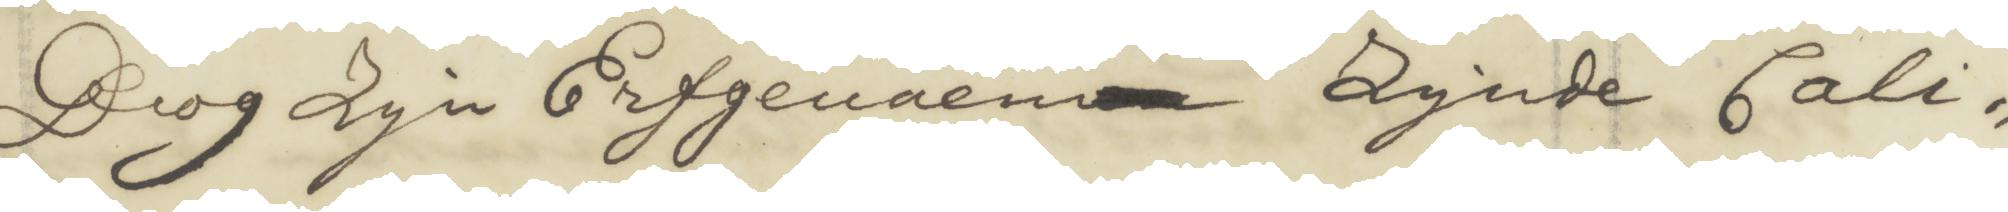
Dog zijn Erfgenaem zijnde Cali„
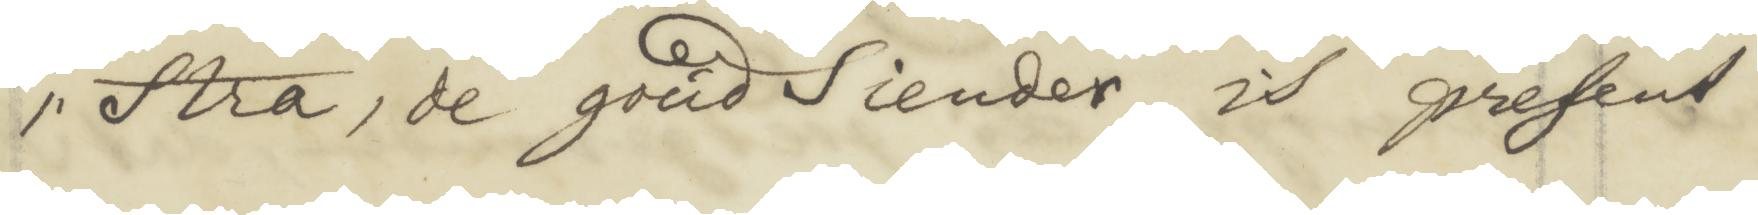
„stra, de goudsiender is present
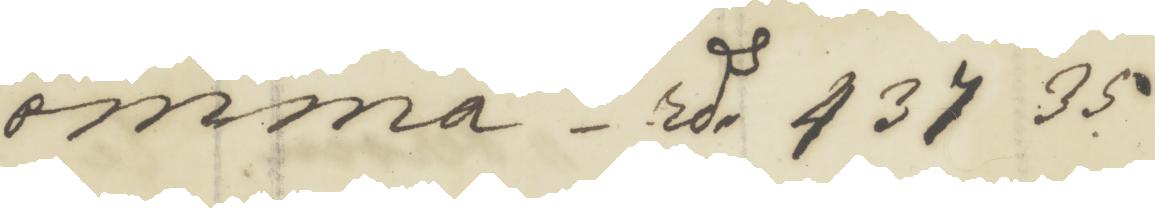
Somma - rd„s 437 35
